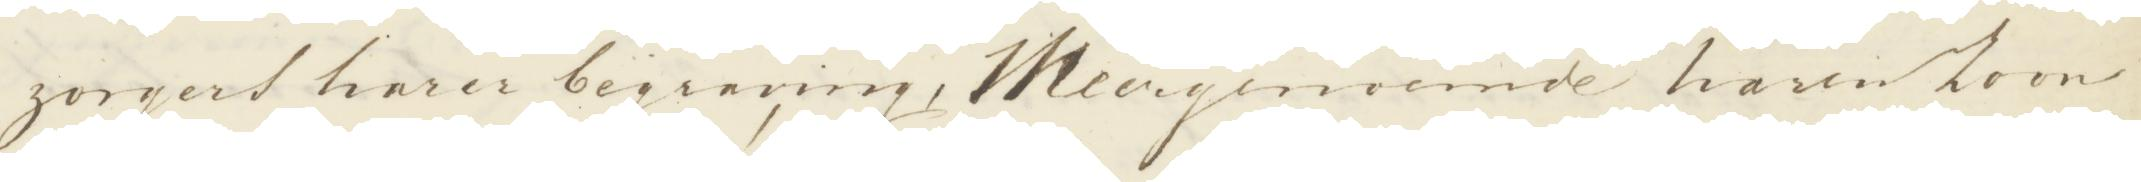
zorgers harer begraving, Meergenoemde haren Zoon
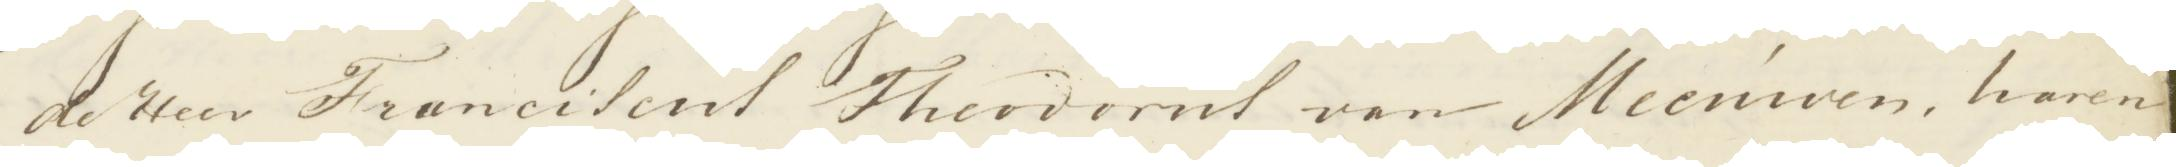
de Heer Franciscus Theodorus van Meeuwen, haren
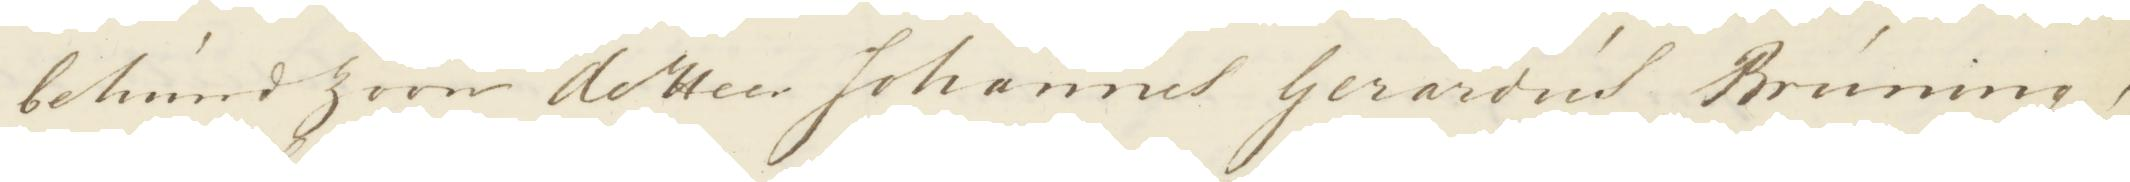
behuwd zoon de Heer Johannes Gerardus Bruning,
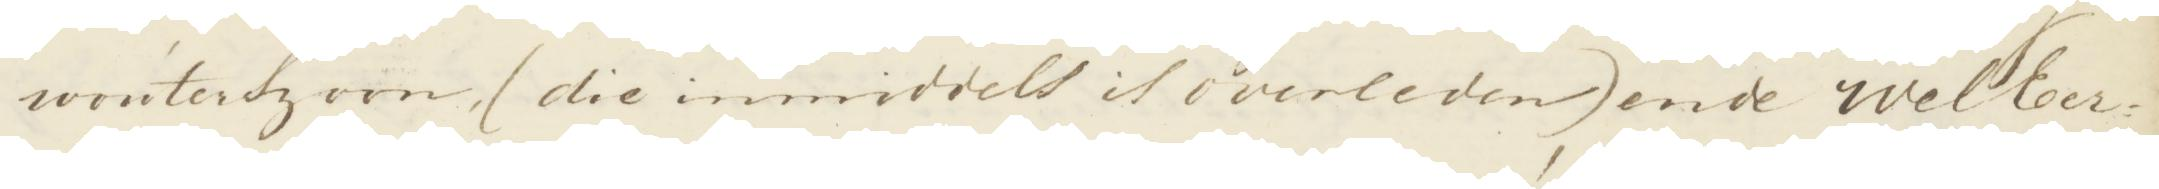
wouterszoon, (die inmiddels is overleden) en de wel Eer=
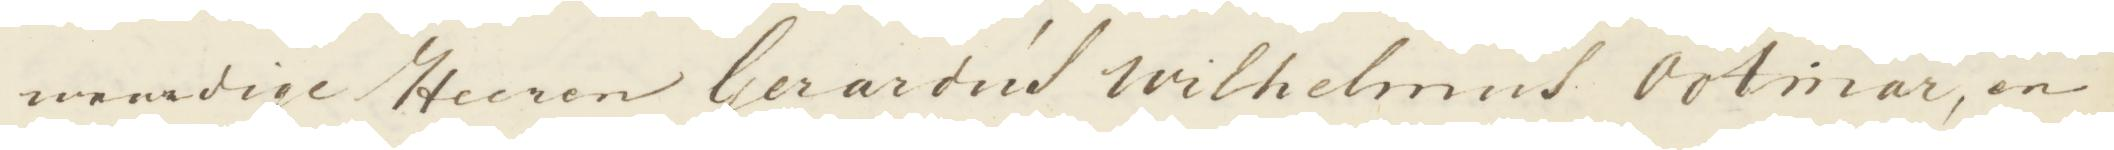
waardige Heeren Gerardus Wilhelmus Ootmar, en
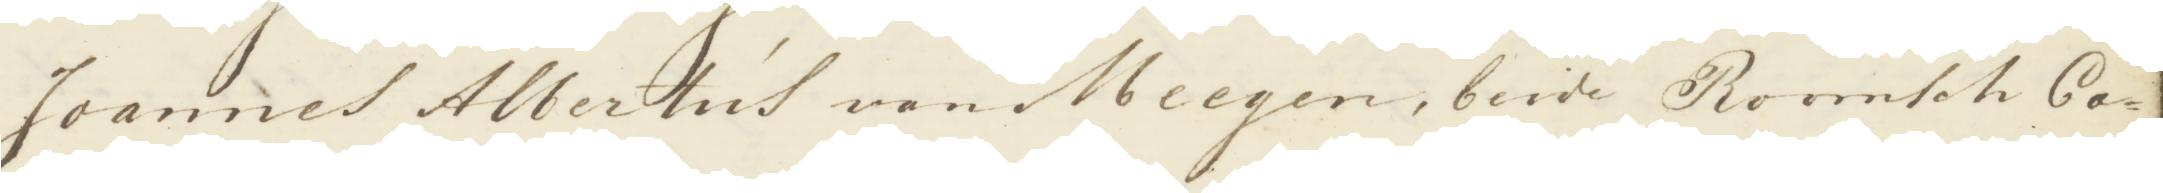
Joannes Albertus van Meegen, beide Roomsch Ca=
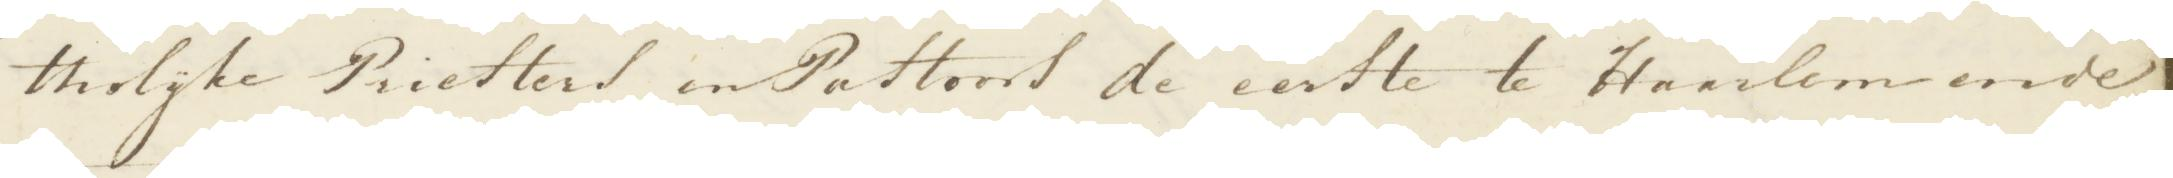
tholijke Priesters en Pastoors de eerste te Haarlem en de
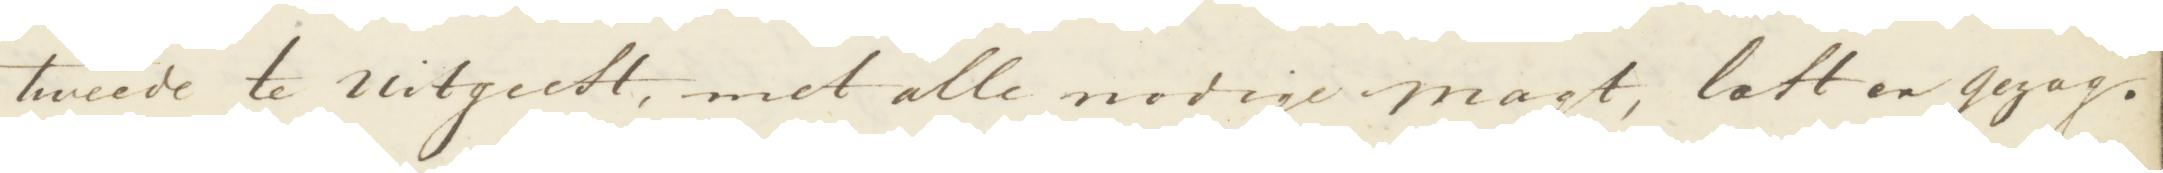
tweede te Uitgeest, met alle nodige magt, last en gezag.
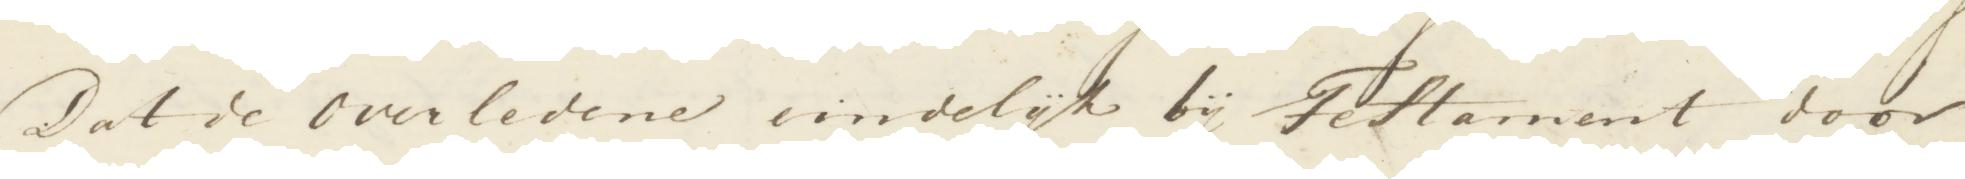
Dat de overledene eindelijk bij Testament door
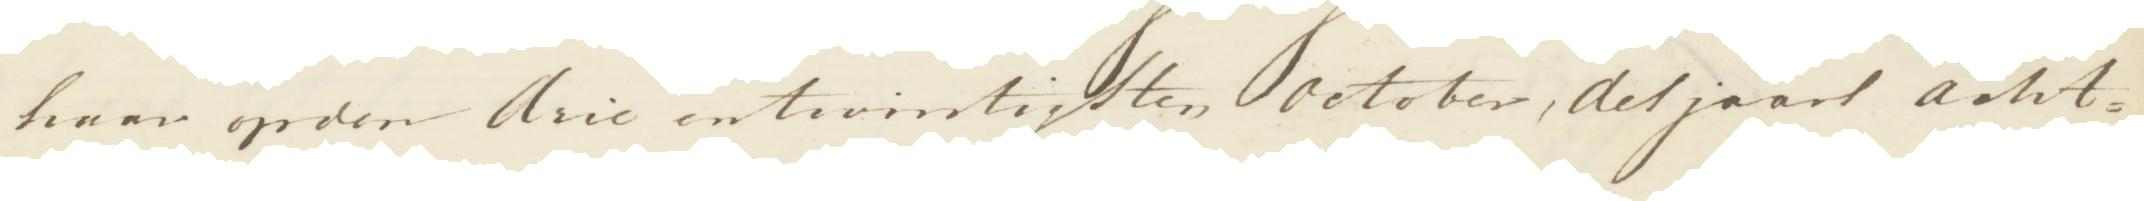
haar op den drie en twintigsten October, des jaars acht=
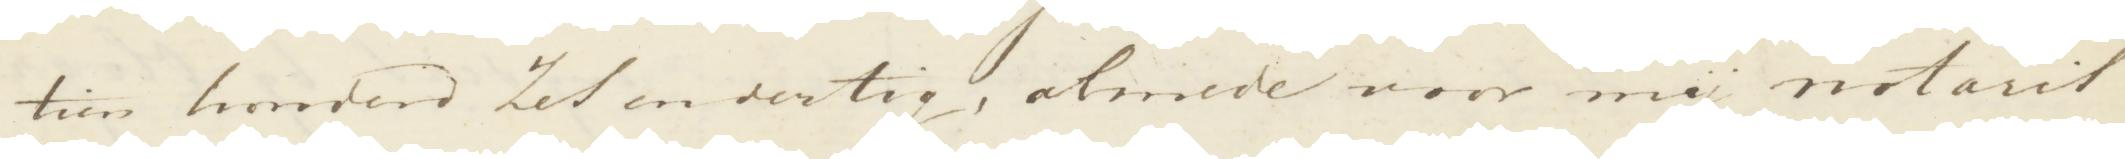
tien honderd Zes en dertig, almede voor mij notaris
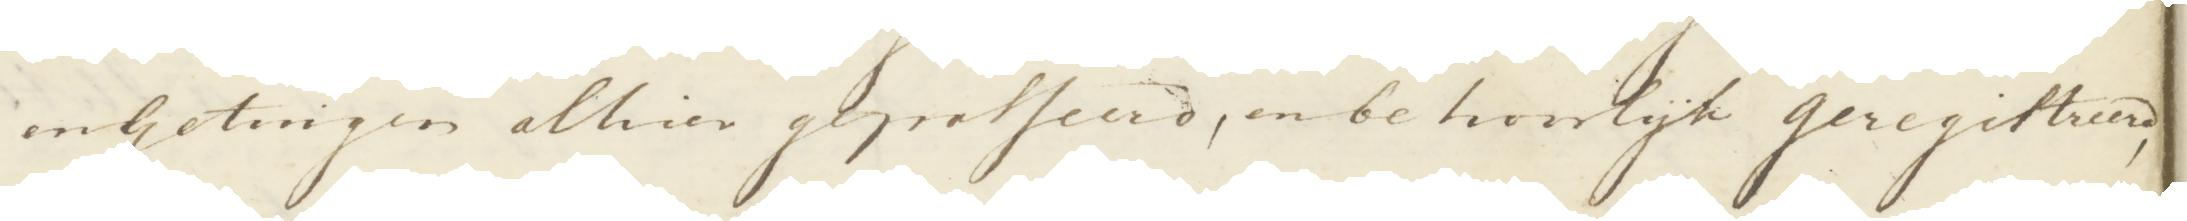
en Getuigen alhier gepasseerd, en behoorlijk geregistreerd,
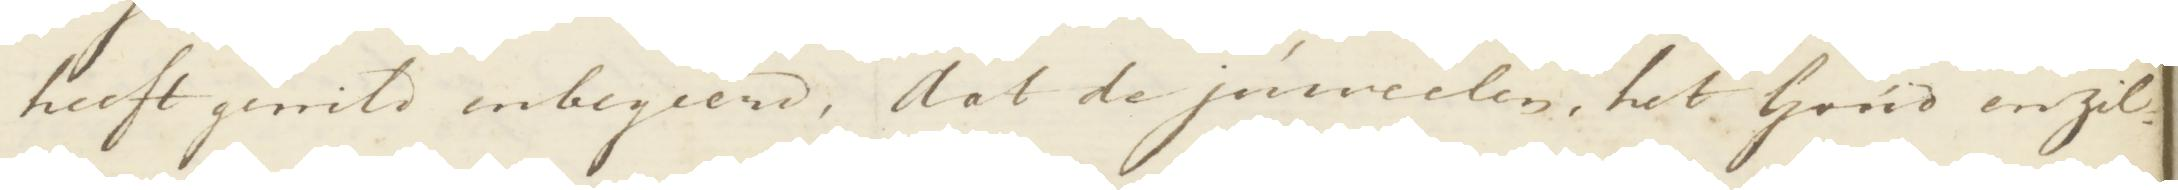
heeft gewild en begeerd, dat de juweelen, het Goud en zil=
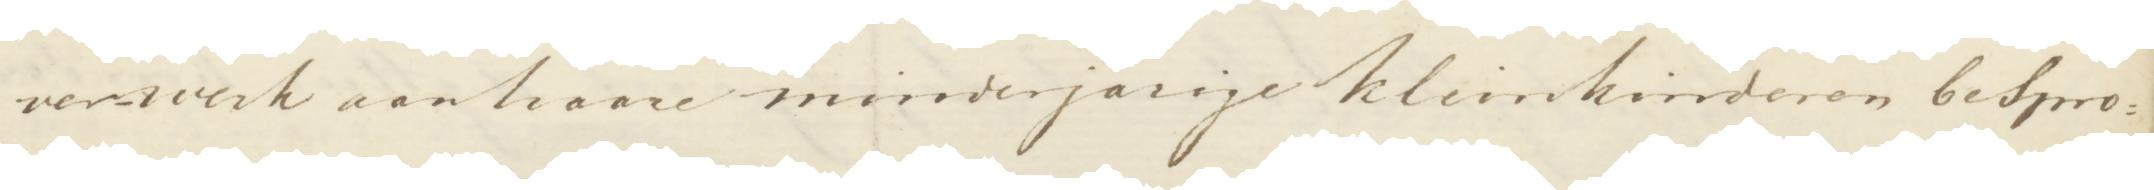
verwerk aan haare minderjarige kleinkinderen bespro=
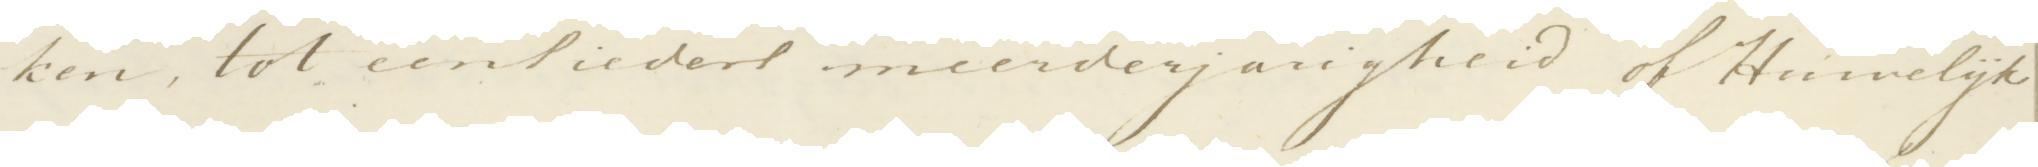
ken, tot eens ieders meerderjarigheid of Huwelijk
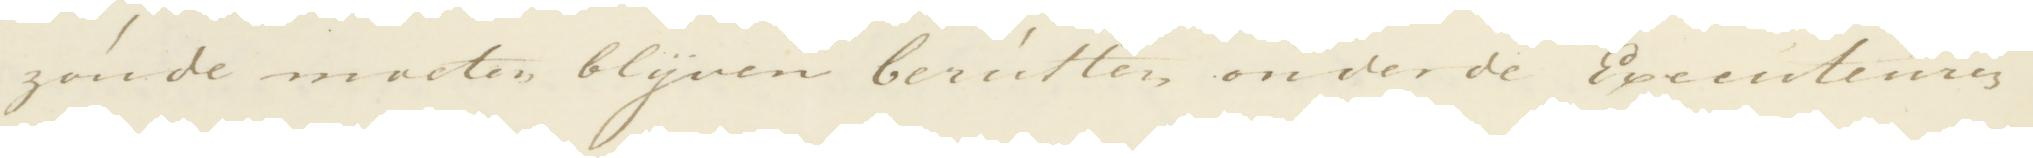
zoude moeten blijven berusten onder de Executeuren
